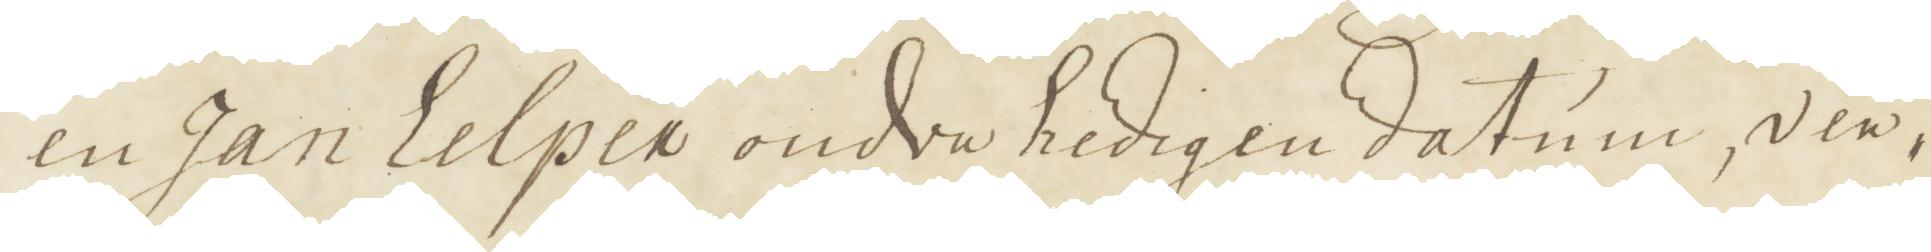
en Jan helper onder hedigen datum, ver„
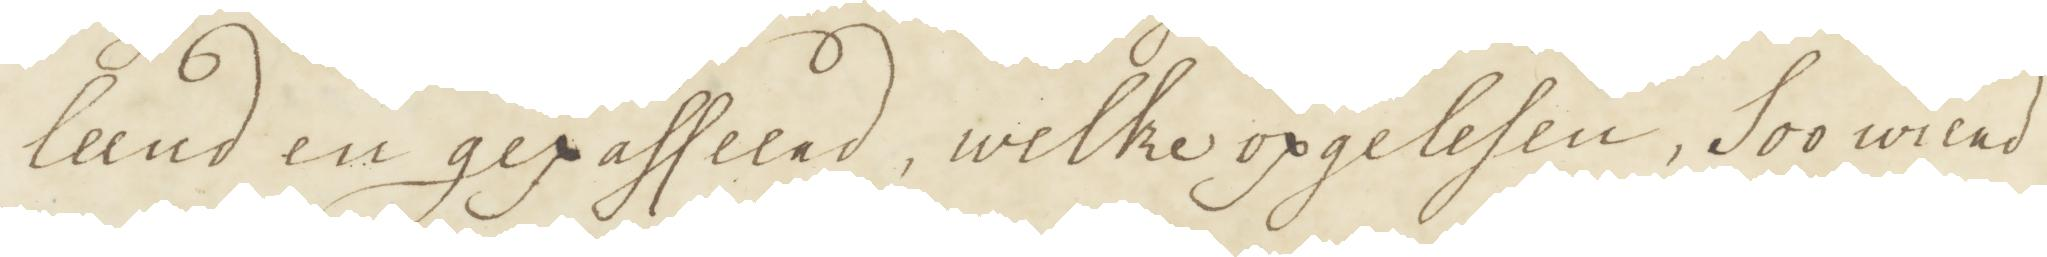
leend en gepasseerd, welke opgelesen, soo wierd
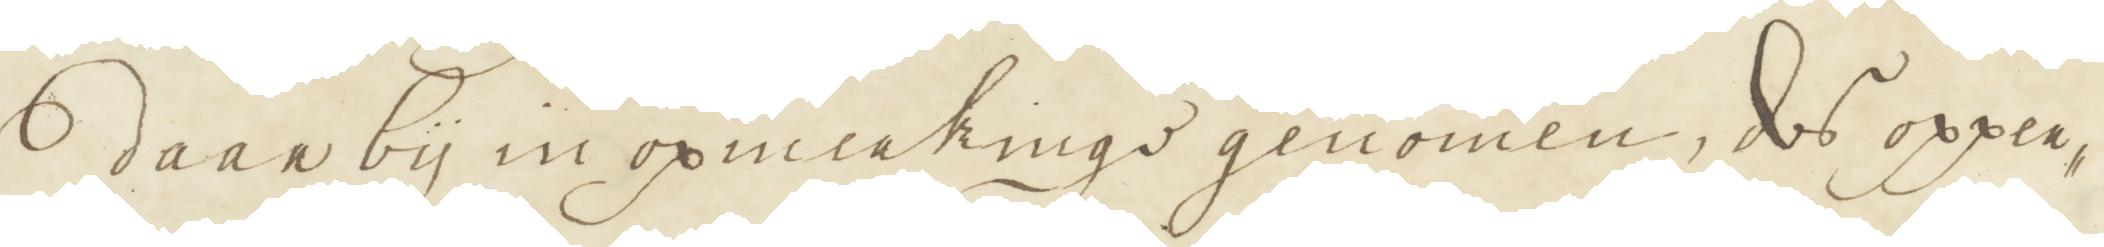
daar bij in opmerkinge genomen, des opper„
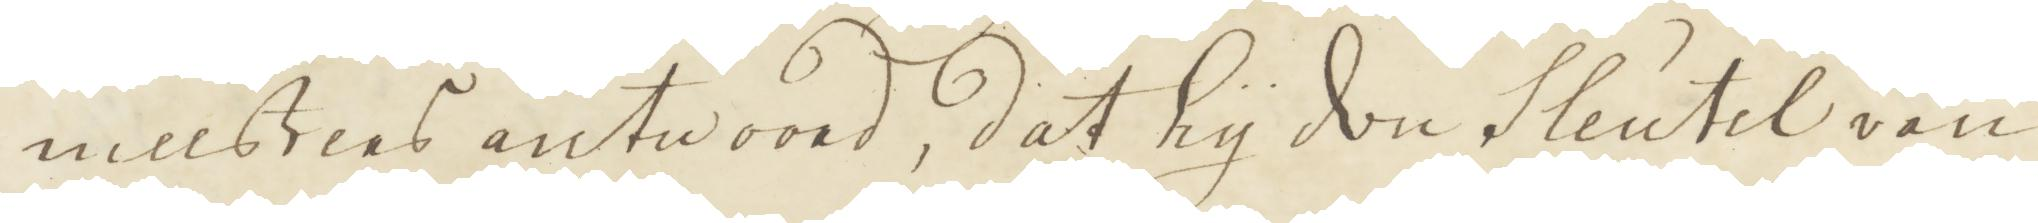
meesters antwoord, dat hij den sleutel van
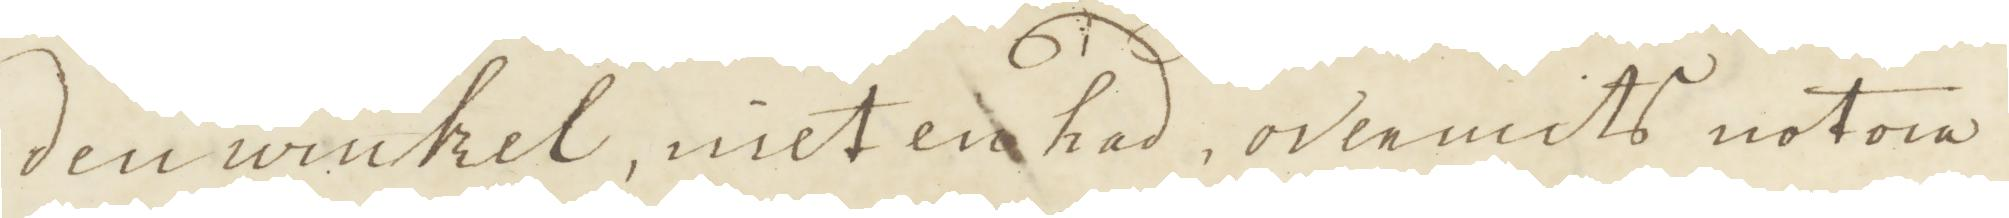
den winkel, niet en had, overmits notoir
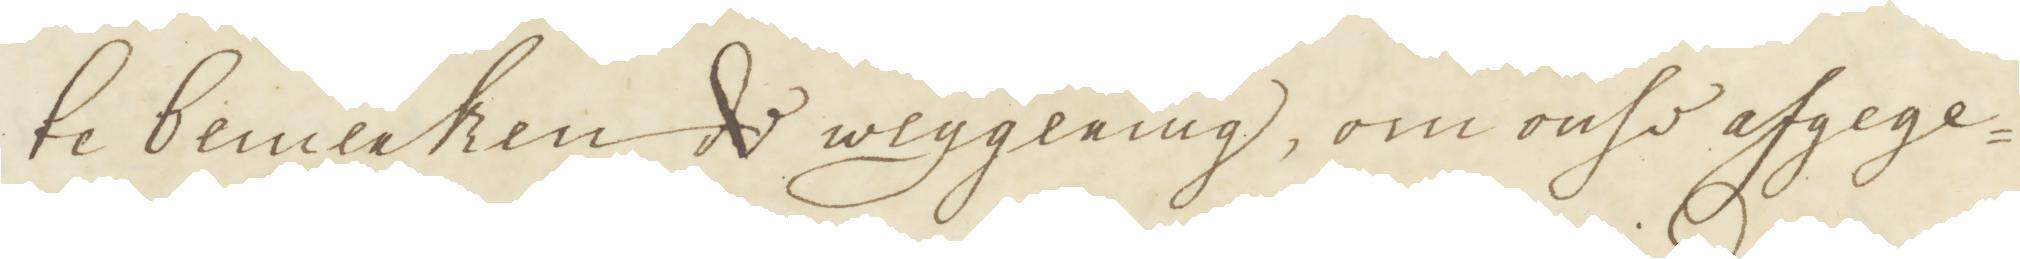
te bemerken de weijgering, om onse afgege=
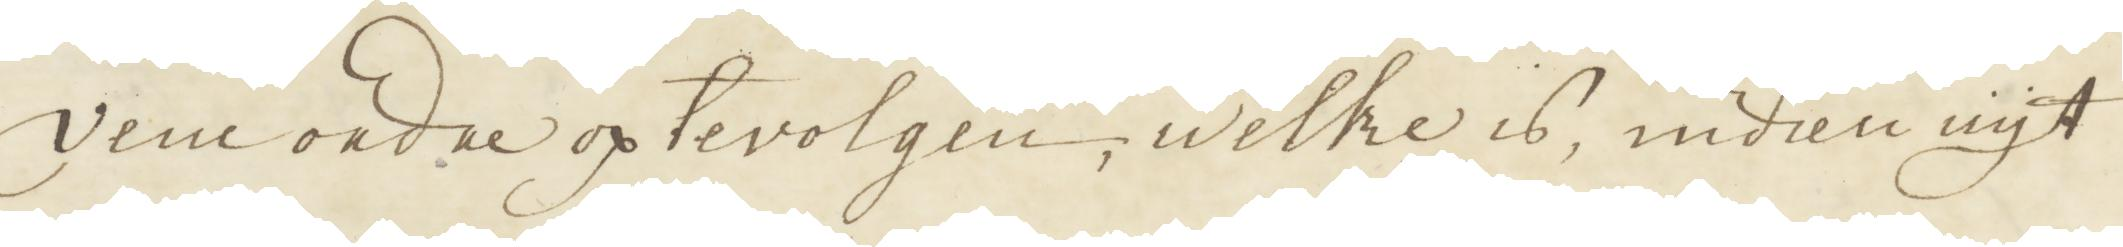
vene ordre op tevolgen, welke is, indien uijt
